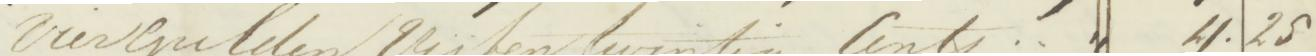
Vier Gulden Vijfen twintig Cents . . „ 4.25
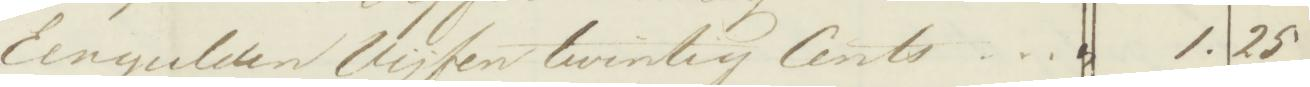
Een gulden Vijfen twintig Cents . . . „ 1.25
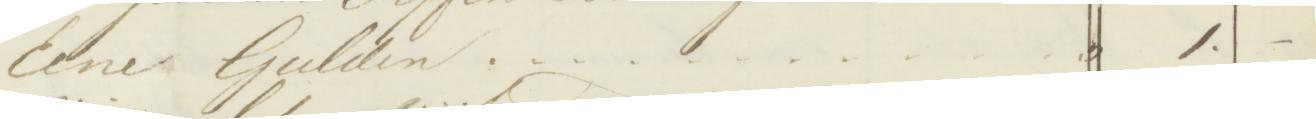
Eene Gulden . . . . . . . . . . . „ 1. -
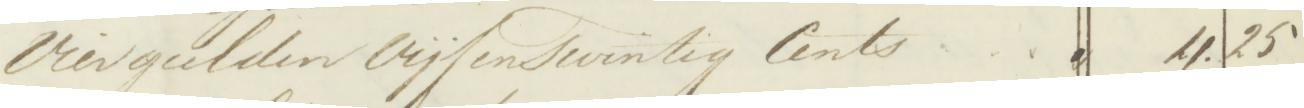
Vier gulden vijf enTwintig Cents . . . „ 4.25
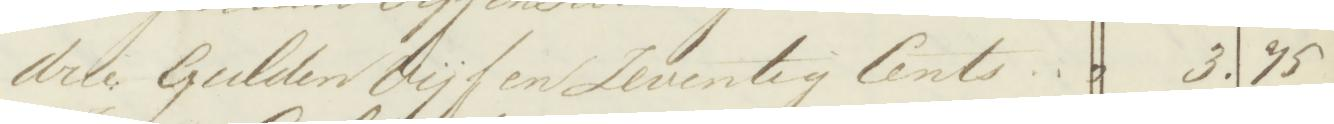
drie Gulden Vijf en Zeventig Cents . . „ 3.75
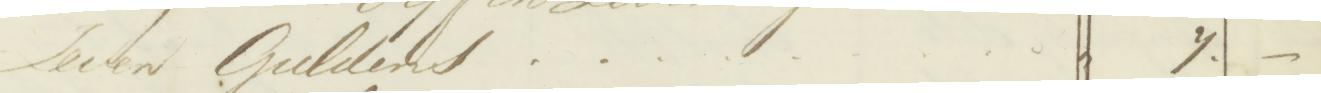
Zeven Guldens . . . . . . . . . „ 7.—
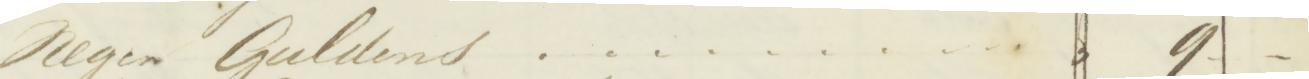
Negen Guldens . . . . . . . . . . „ 9.—
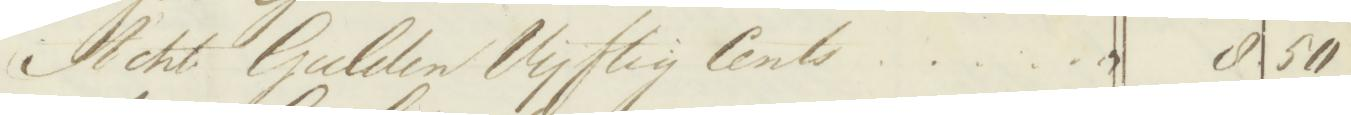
Acht Gulden Vijftig Cents . . . . . . „ 8.50
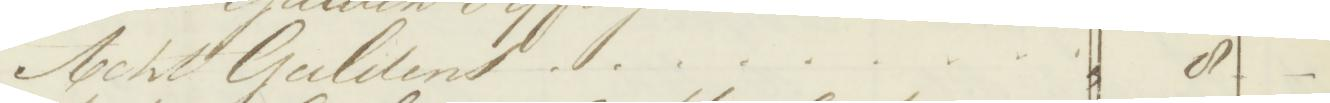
Acht Guldens . . . . . . . . . . „ 8.—
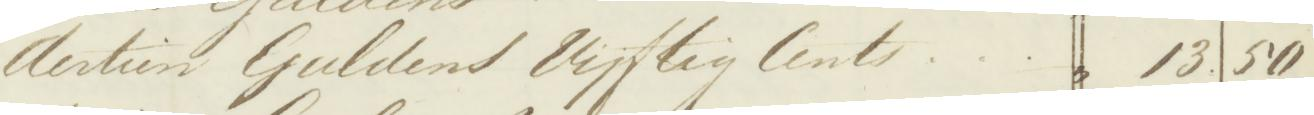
dertien Guldens Vijftig Cents . . . „ 13.50
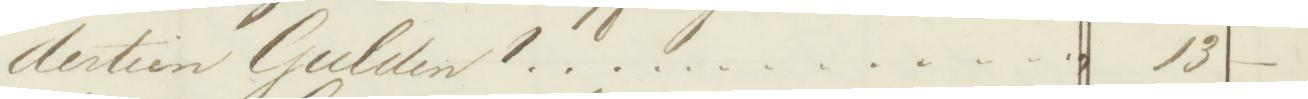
dertien Guldens . . . . . . . . . . . . . „ 13 —
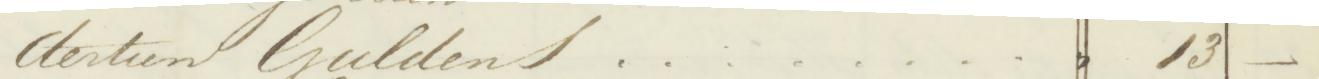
dertien Guldens . . . . . . . . „ 13 —
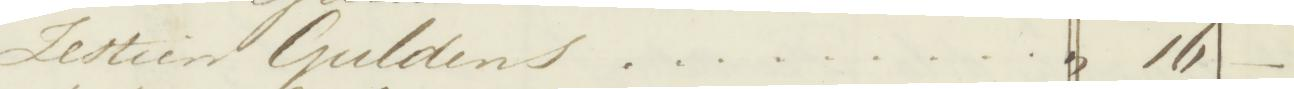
Zestien Guldens . . . . . . . . . „ 16 —
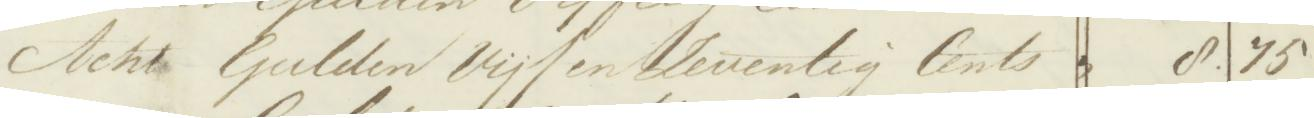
Acht Gulden Vijf en Zeventig Cents „ 8.75
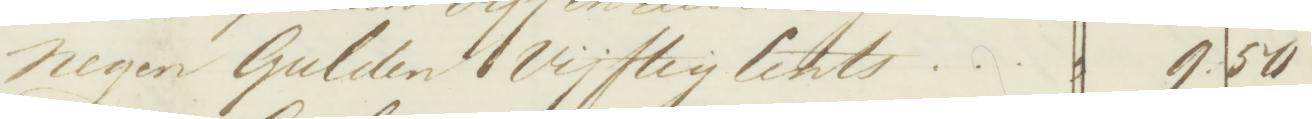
negen Gulden Vijftig Cents . . . „ 9.50
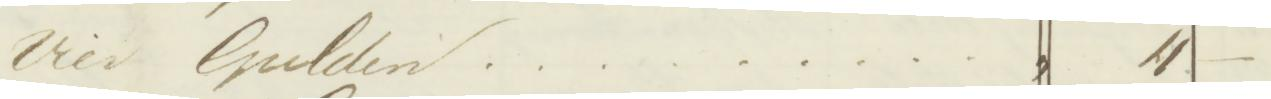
Vier Gulden . . . . . . . . . „ 4 —
